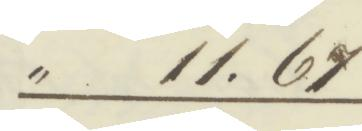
„ 11.67
